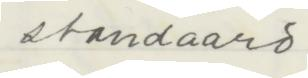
standaard
